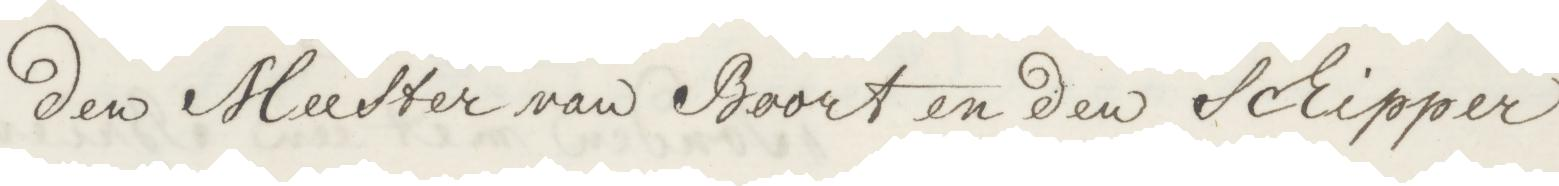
den Meester van Boort en den schipper
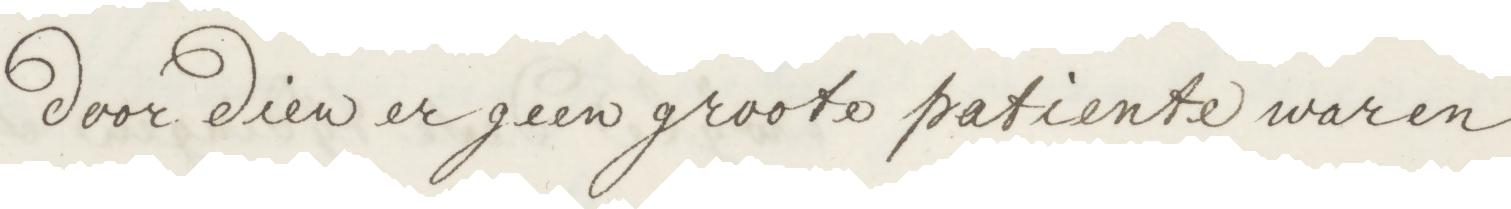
door dien er geen groote patiente waren
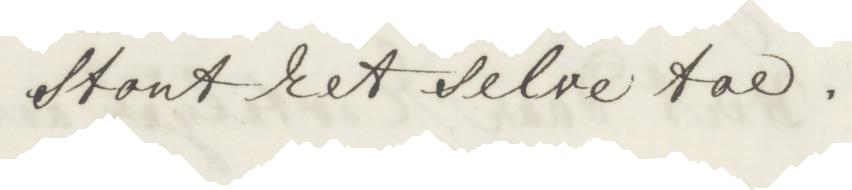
stont het selve toe.
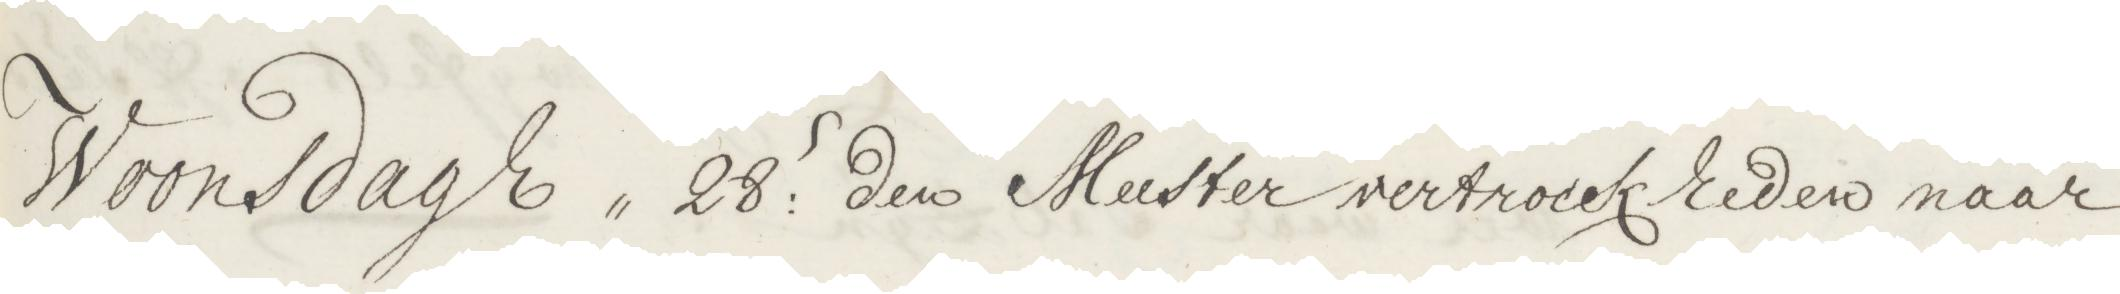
Woonsdagh „ 28:' den Meester vertrock heden naar
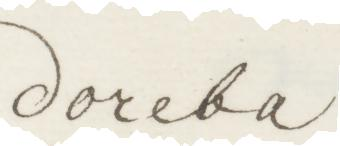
doreba
